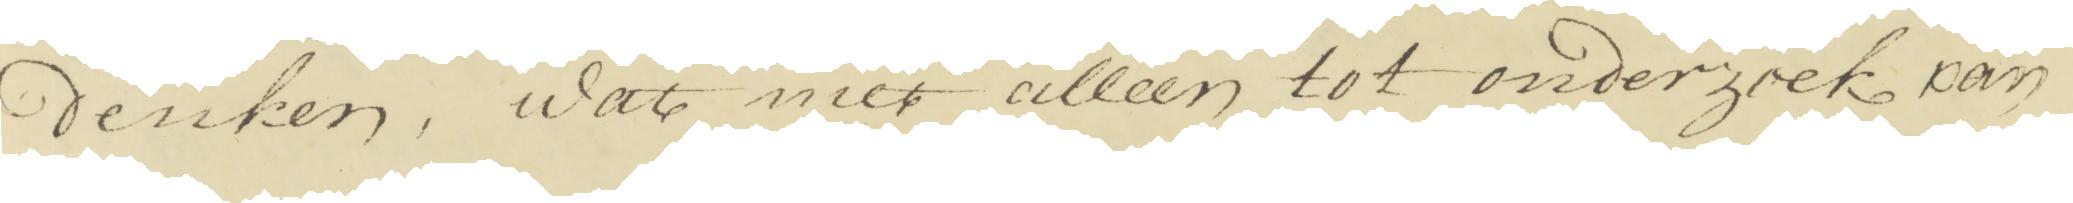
denken, wat niet alleen tot onderzoek van
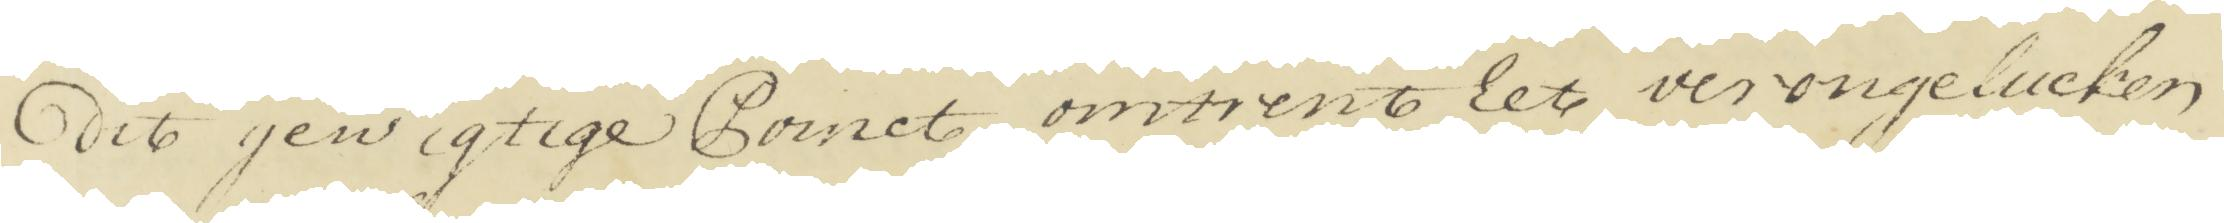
dit gewigtige Poinct omtrent het verongelucken
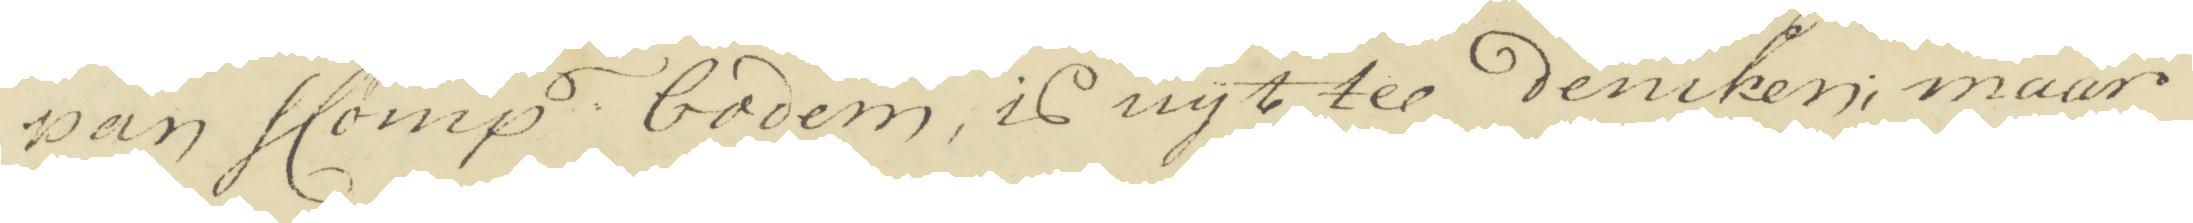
van sComp:s bodem, is uijt te dencken; maar
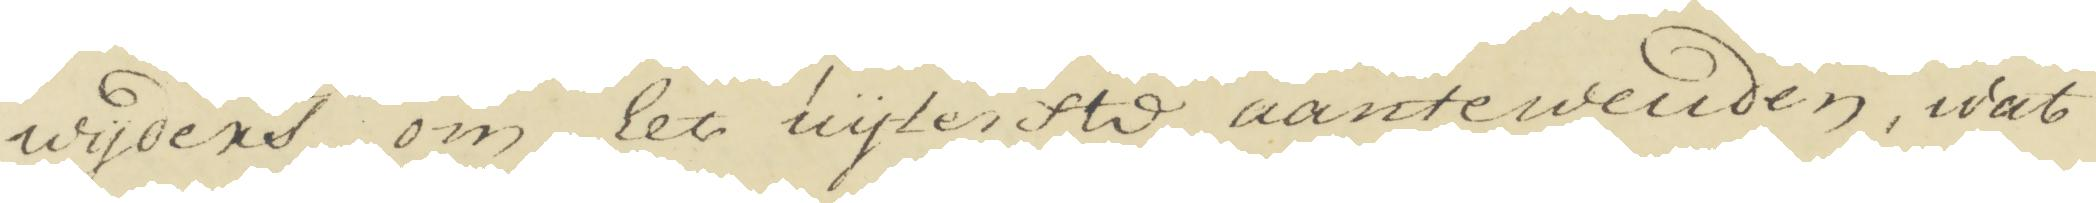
wijders om het uijterste aantewenden, wat
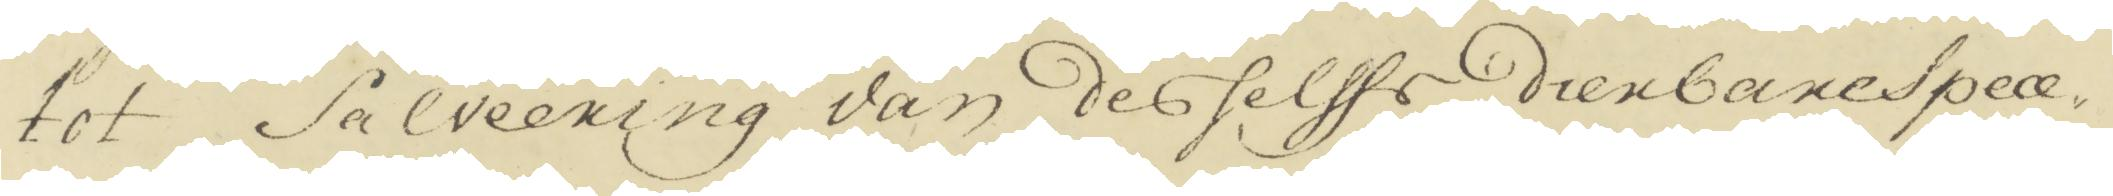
tot salveering van desselffs dierbarespece„
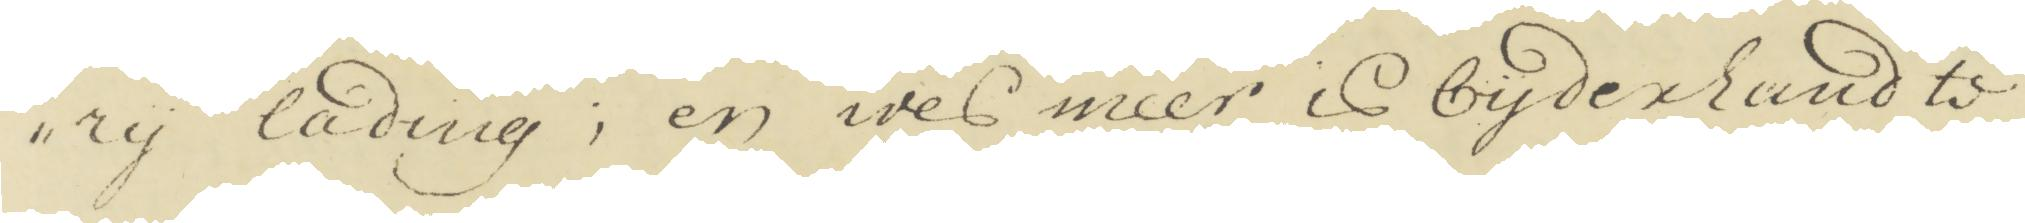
„rij lading; en wes meer is bijderhand te
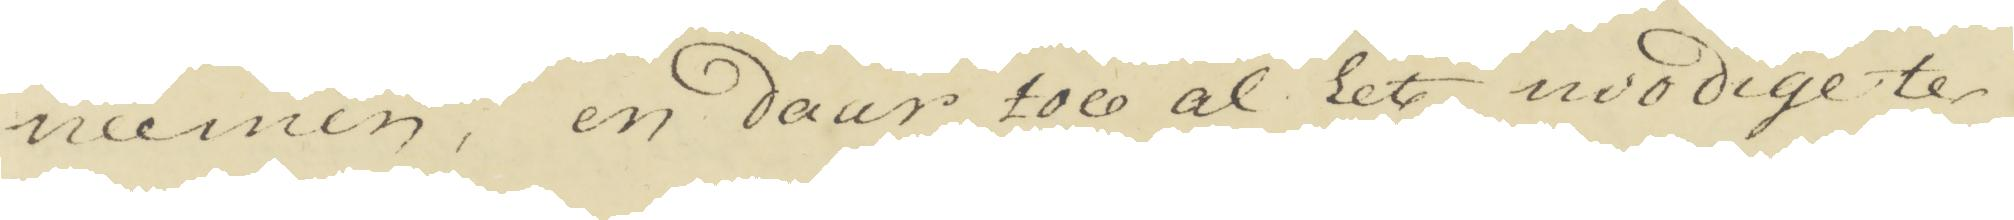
neemen, en daar toe al het noodige te
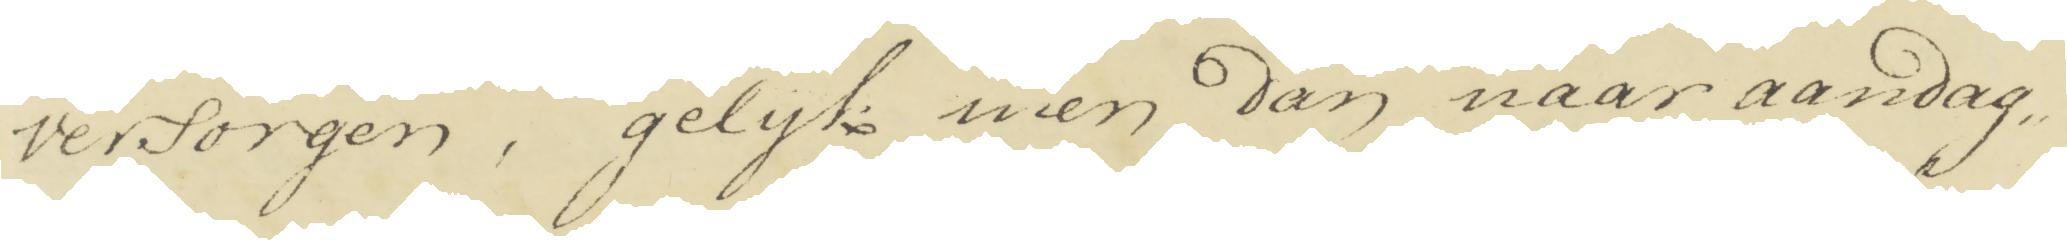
versorgen, gelijk men dan naar aandag„
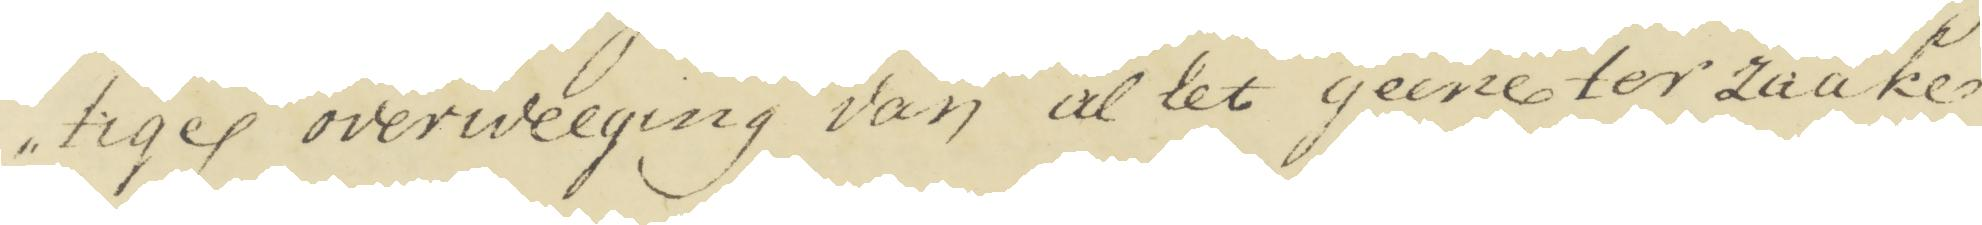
„tige overweeging van al het geene ter zaake
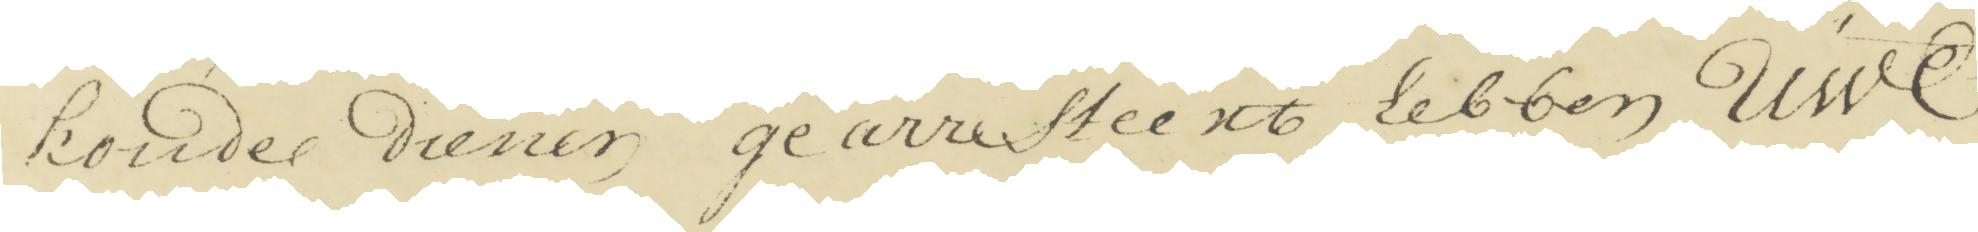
konde dienen gearresteert hebben UWE
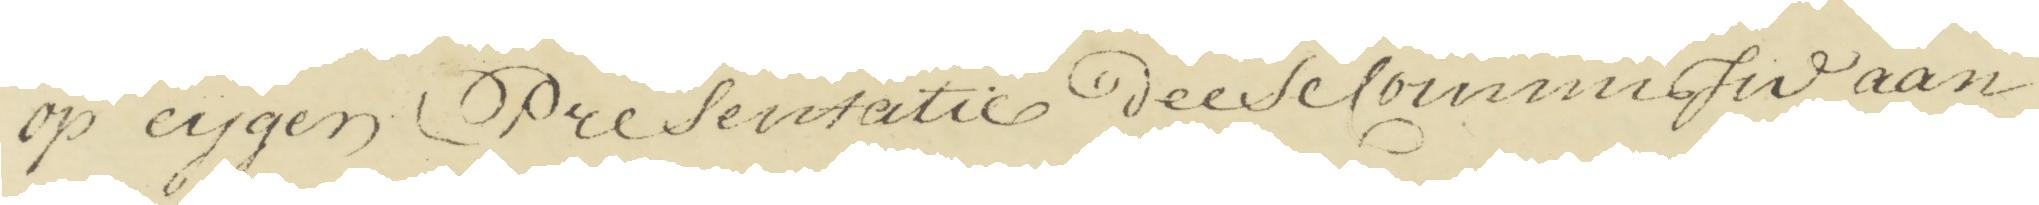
op eygen Presentatie deese commissie aan
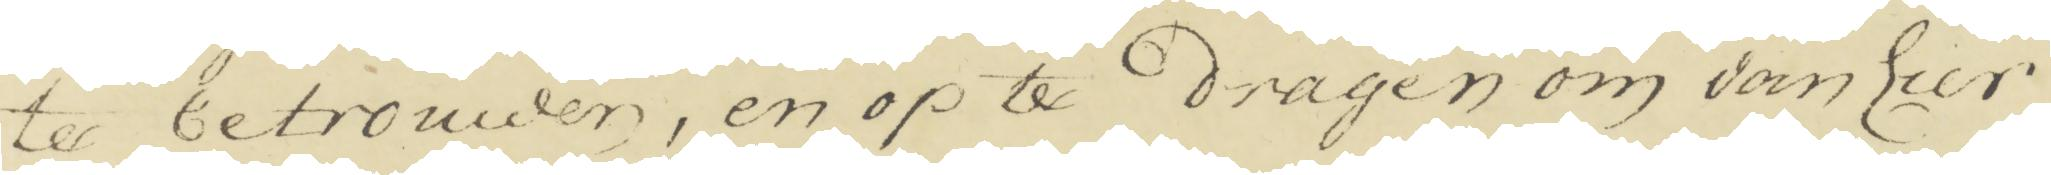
te betrouwen, en op te dragen om van hier
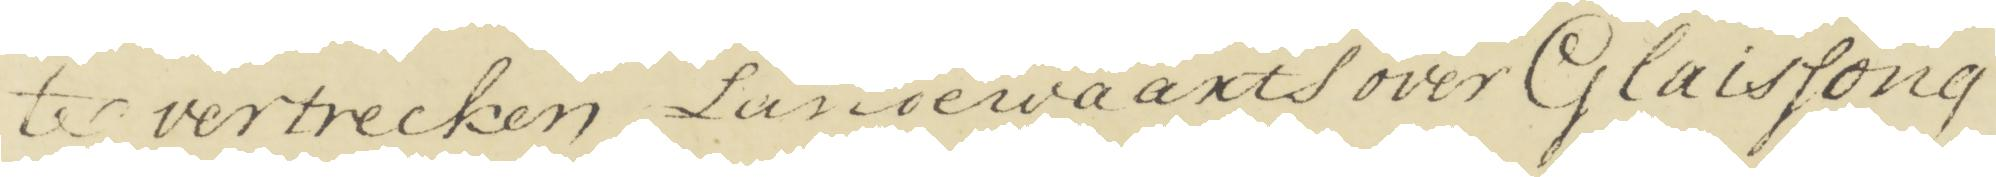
te vertrecken Landewaarts over Glaissong
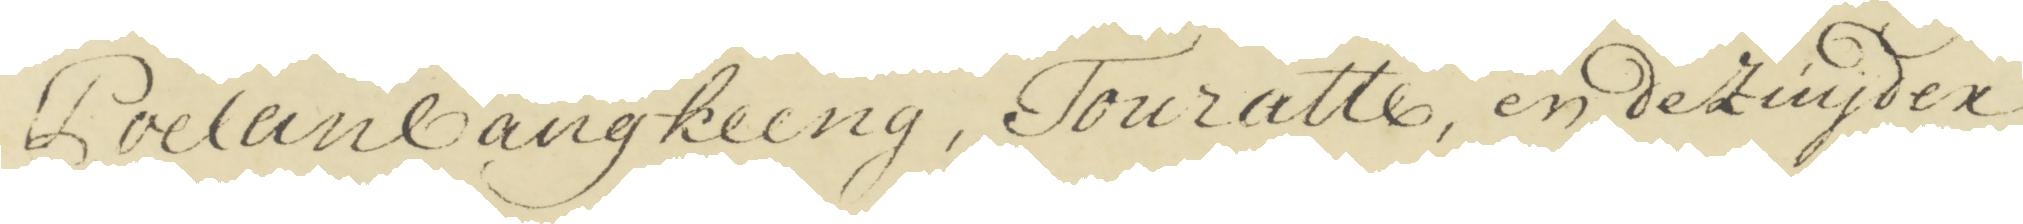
Poelanbangkeeng, Touratte, en de zuijder
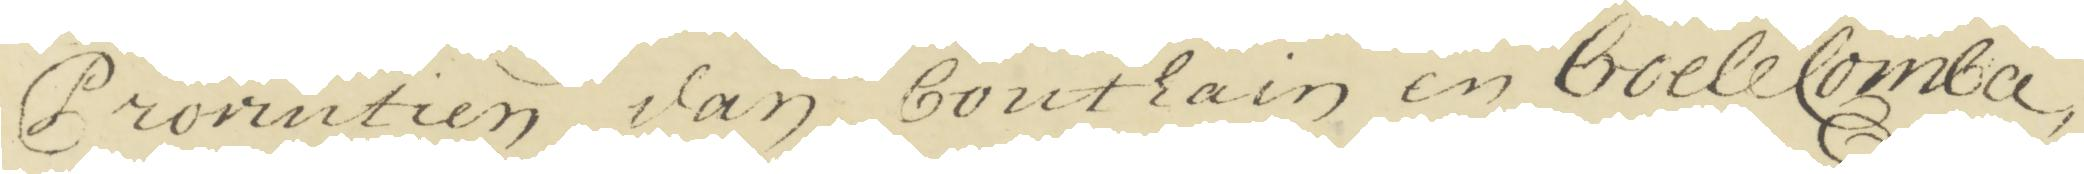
Provintien van bouthain en boelecomba,
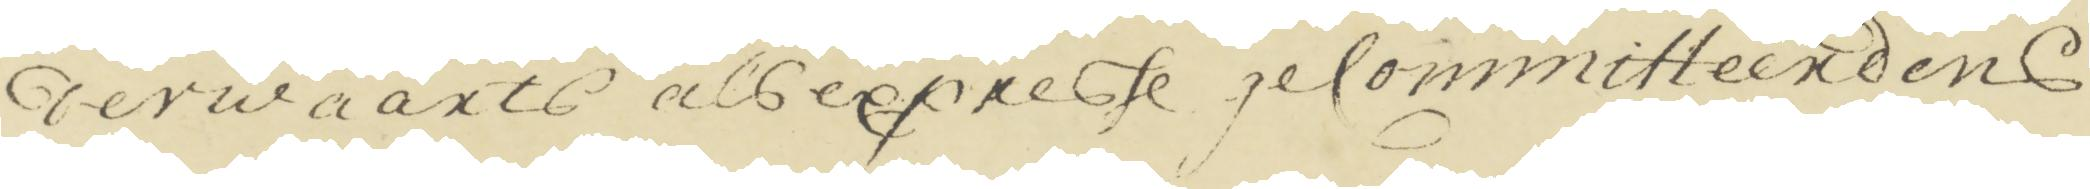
derwaarts als expresse gecommitteerdens
